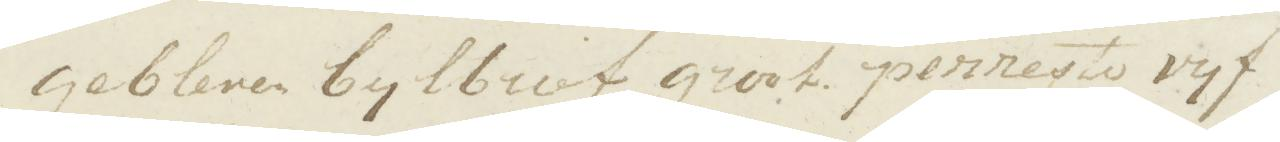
gebleven bylbrief groot perresto vyf
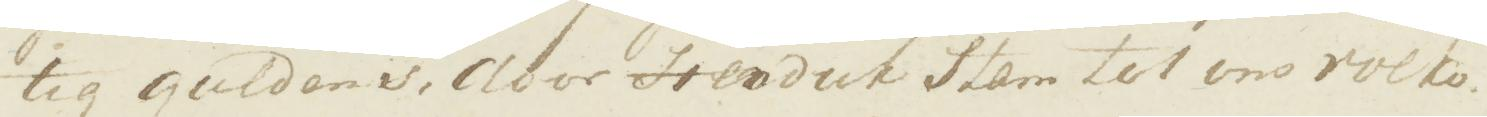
tig guldens, door Hendrik stam tot ons volko.
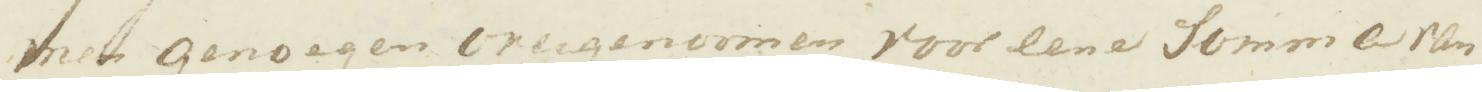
men genoegen overgenoomen voor eene somma van
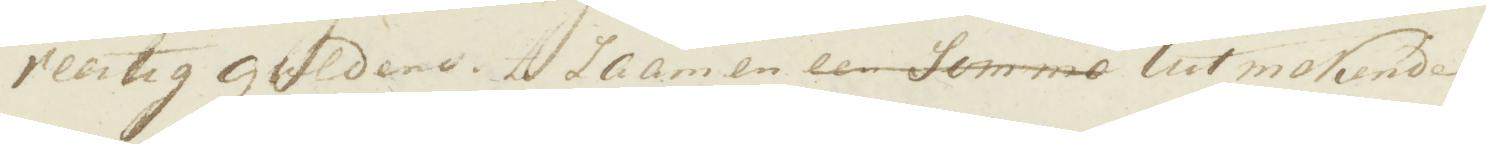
veertig guldens. t zaamen een somma uitmakende
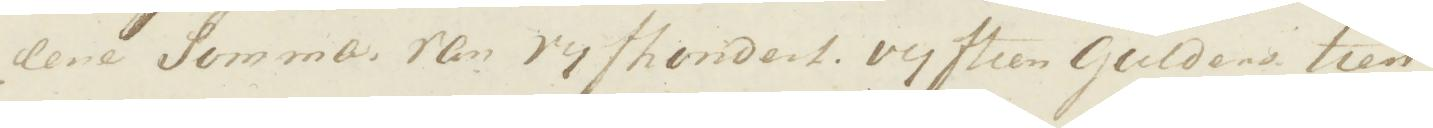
eene somma van vyfhondert. vyftien guldens tien
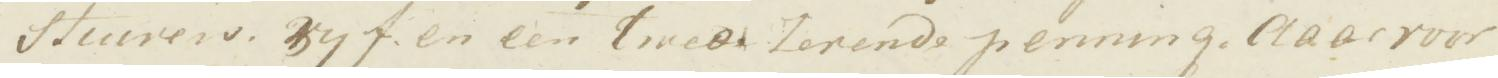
stuivers. vyf en een twede zevende penning, daarvoor
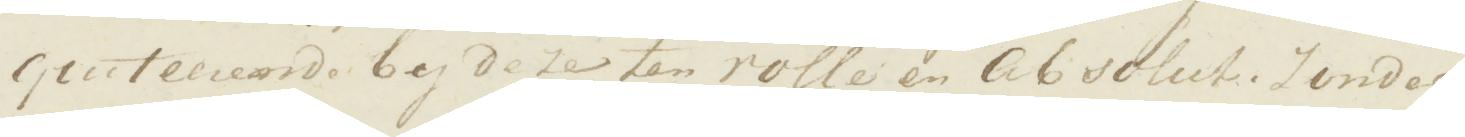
quiteerende by deze ten volle en absolut. zonder
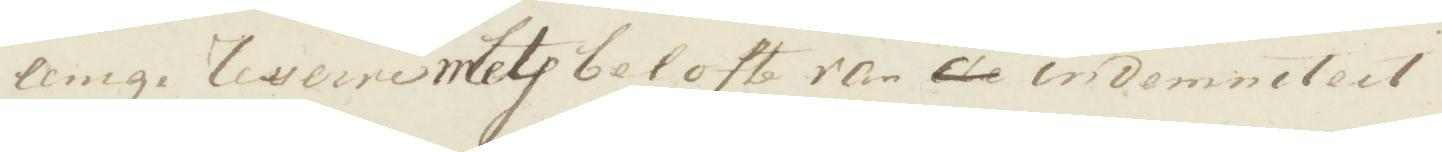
eenige Reserve met belofte van de indemniteit
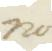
nog
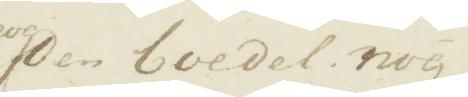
den boedel, nog,
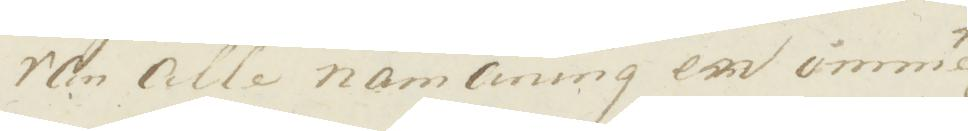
van alle namaning en omme
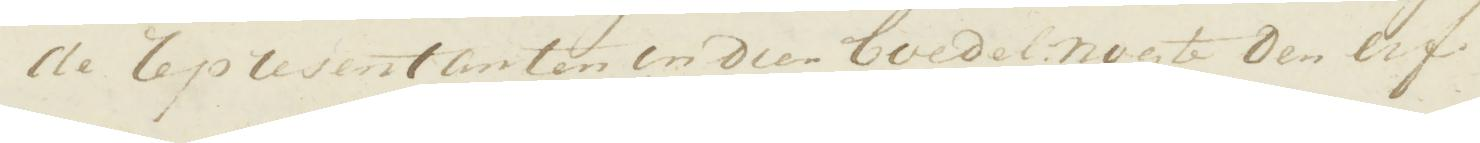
de representanten in dien boedel. nogte den erf
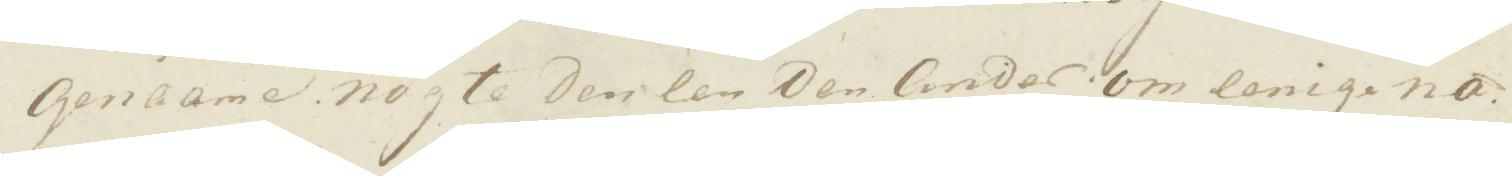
genaame. nogte den een den ander om eenige na.
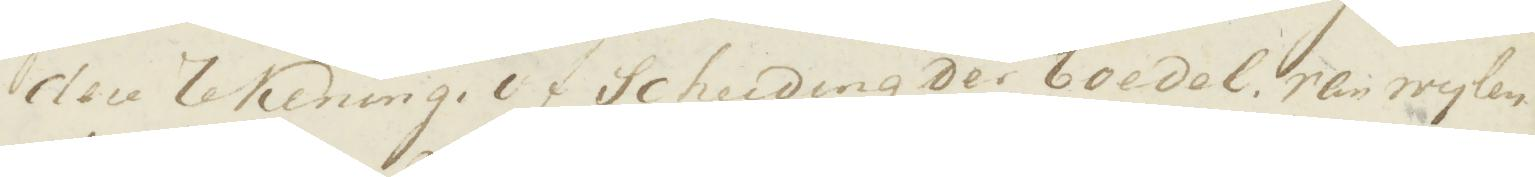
deze Rekening, of scheiding der boedel, van wylen
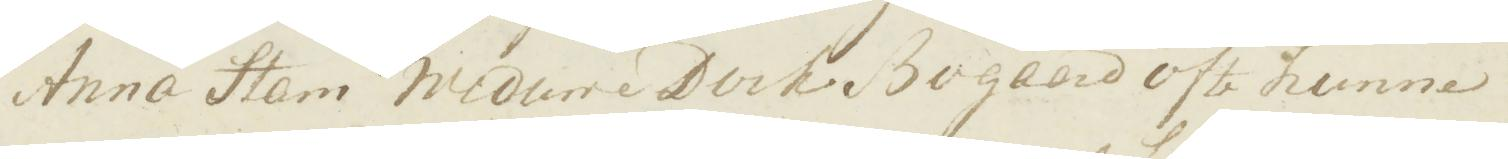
Anna Stam Weduwe Dirk Bogaard ofte hunne
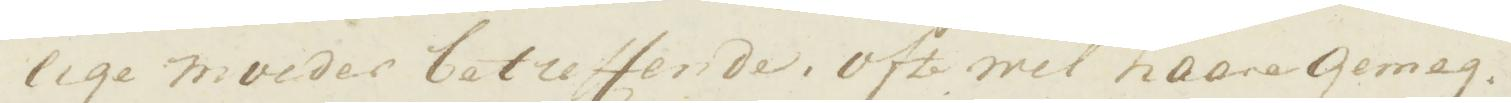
eige moeder betreffende, ofte wel haare gemag„
